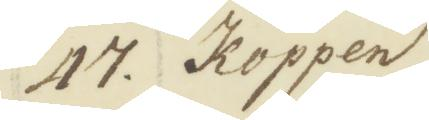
47. Koppen
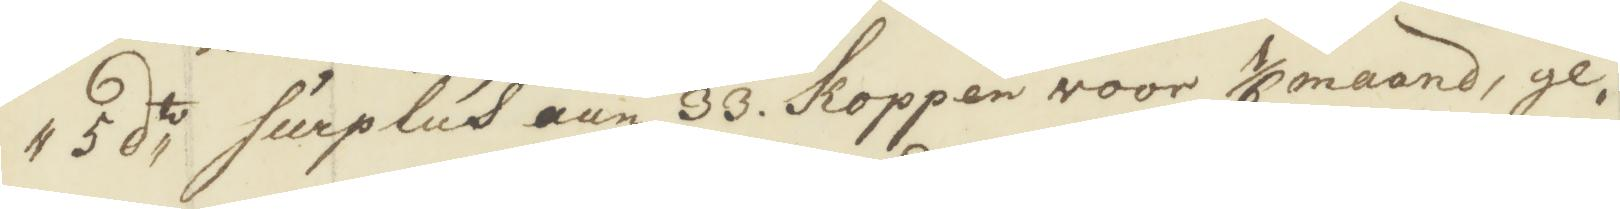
„ 5 d„to Surplus aan 33. koppen voor 1/6 maand, ge„
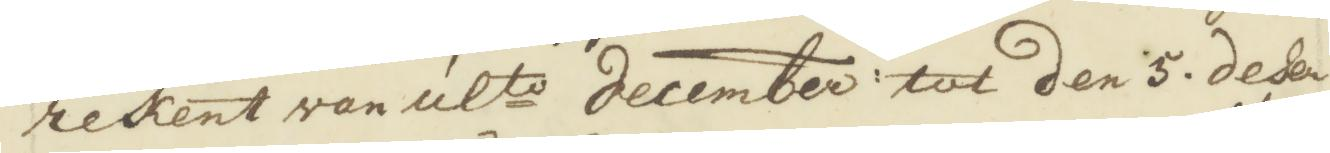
rekent van ul=to december tot den 5. deser
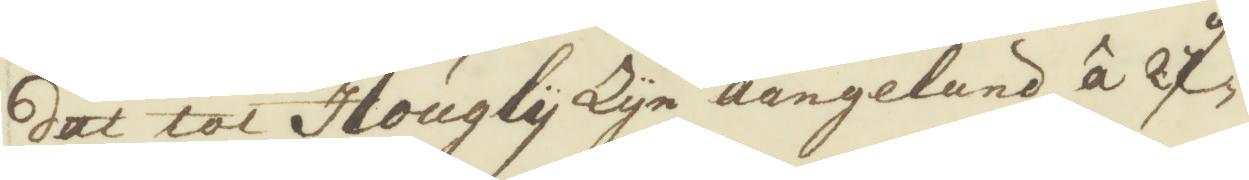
dat toe Houglij zijn aangeland â 2r:o/,
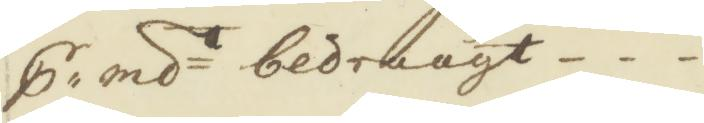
p„r md=t bedraagt - - -
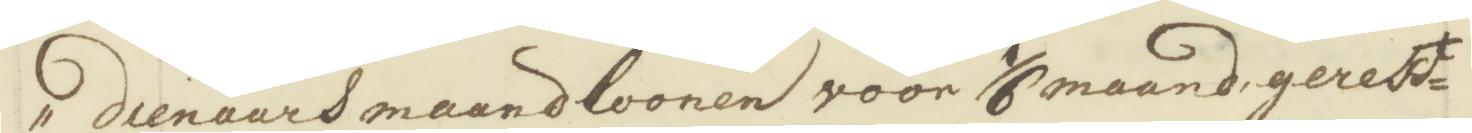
„ dienaars maandloonen voor 1/6 maand, gerek=t
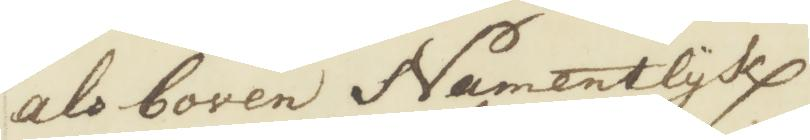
als boven Namentlijk
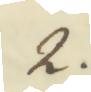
2.— .—.
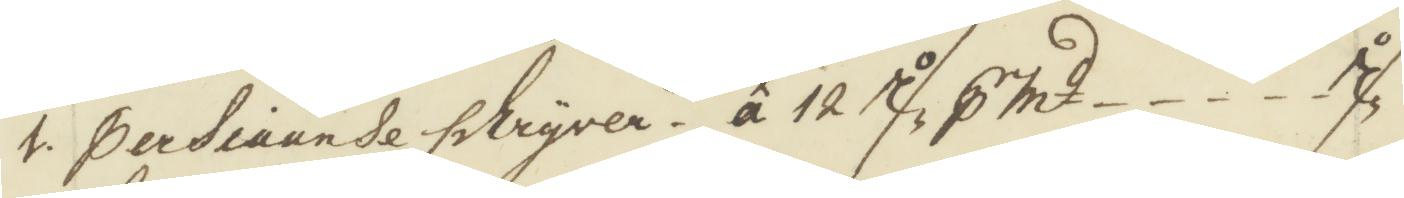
1. persiaanse schrijver - â 12r:o/, „ p:r m=d - - - - - r:o/,
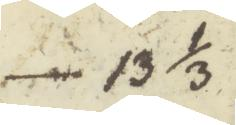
— 13 1/3
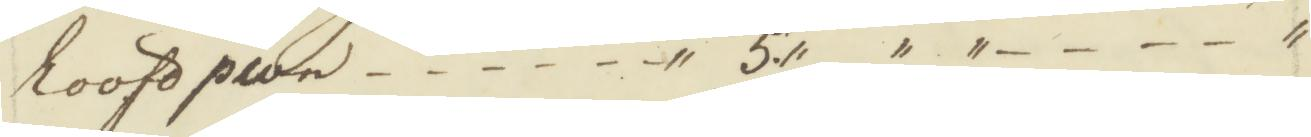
hoofd pion - - - - - - „ 5.„ „ „ - - - - „
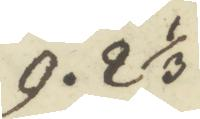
9. 2 1/3
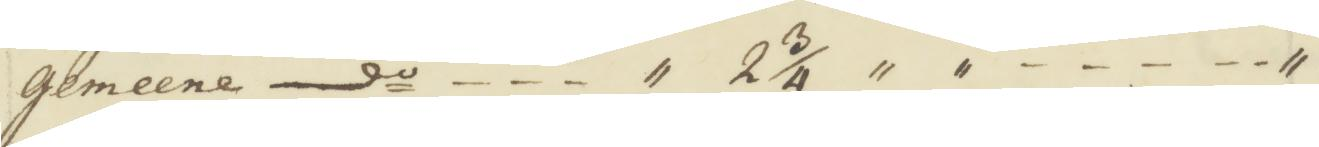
gemeene D:o - - - „ 2¾ „ „ - - - - - „
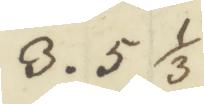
3. 5 1/3
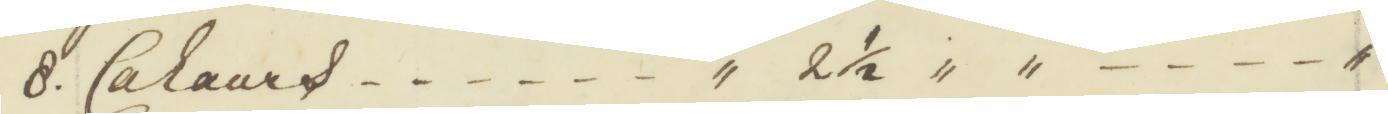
8. Cahaars - - - - - - „ 2½ „ „ — - - - „
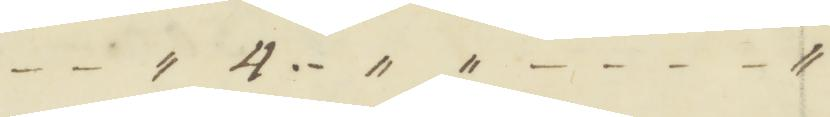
- - „ 4 .- „ „ - - - -
